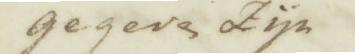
gegeven zijn
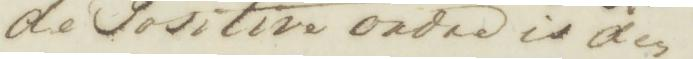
de Positive ordre is den
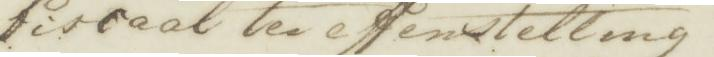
fiscaal ten effenstelling
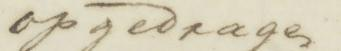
op gedragen
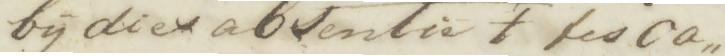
bij dies absentie 't fisca„
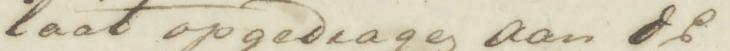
laat opgedragen aan dE
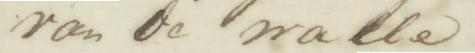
van de walle
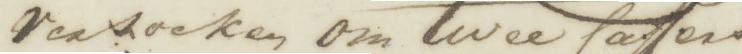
verzoeken om twee Caffers
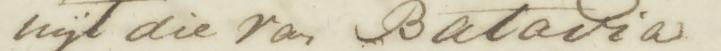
uijt die van Batavia
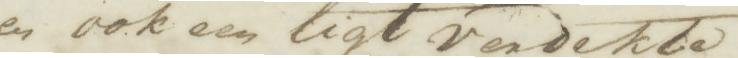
en ook een ligt verdekte
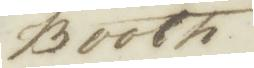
Booth.
